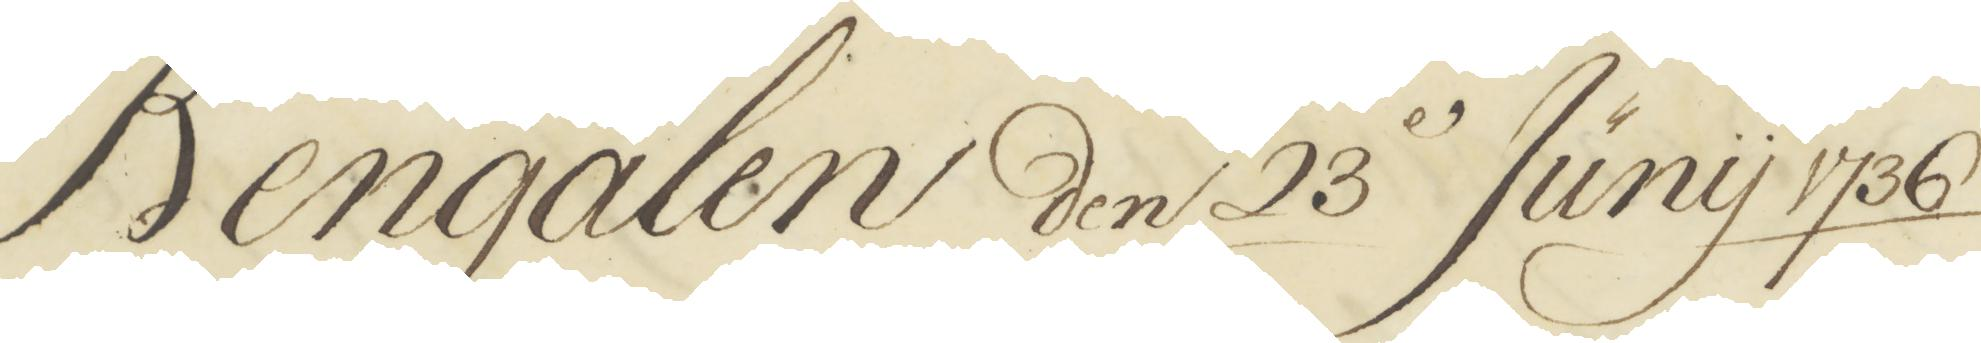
Bengalen den 23e Junij 1736
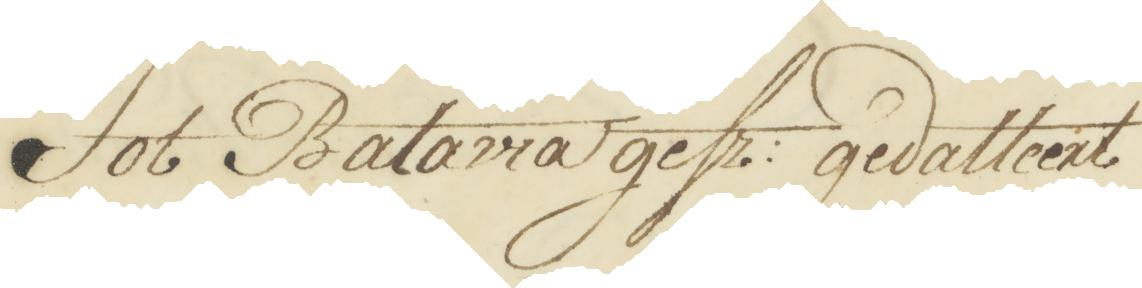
Tot Batavia gesz: gedatteert
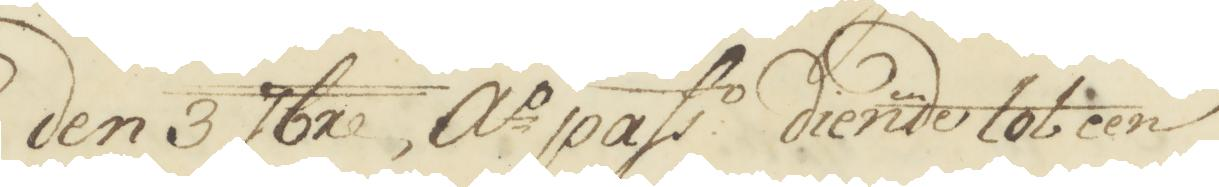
den 3 fbr, A=o pass:o dien:en de tot een
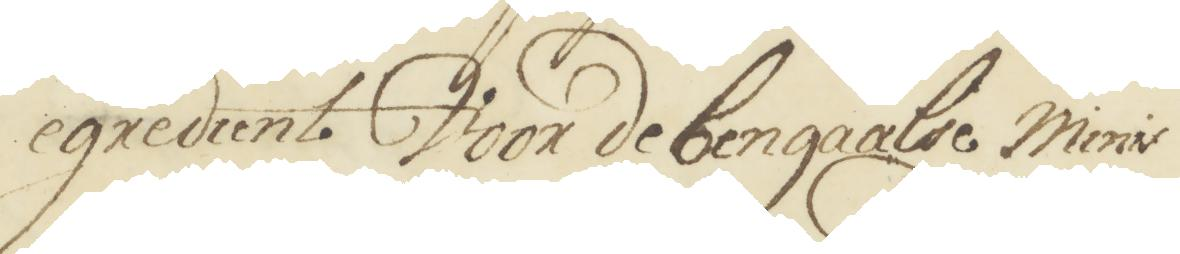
egredient Voor de bengaalse minis
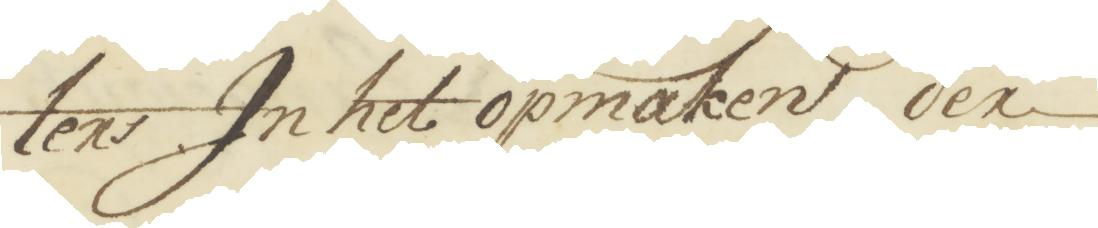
ters Jn het opmaken der
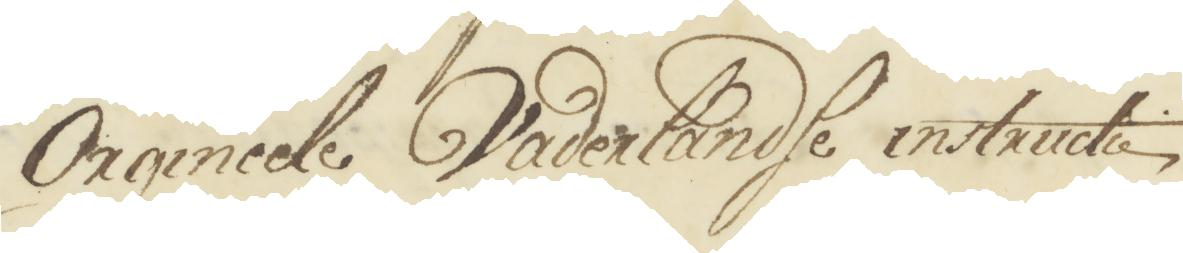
Orgineele Vaderlandse instructie
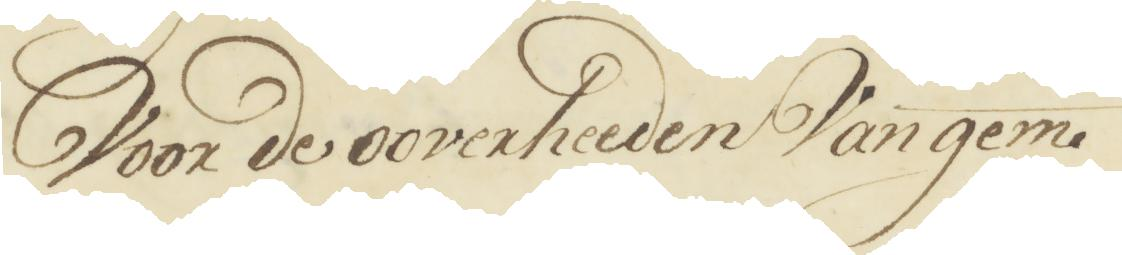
Voor de ooverheeden Van gem.
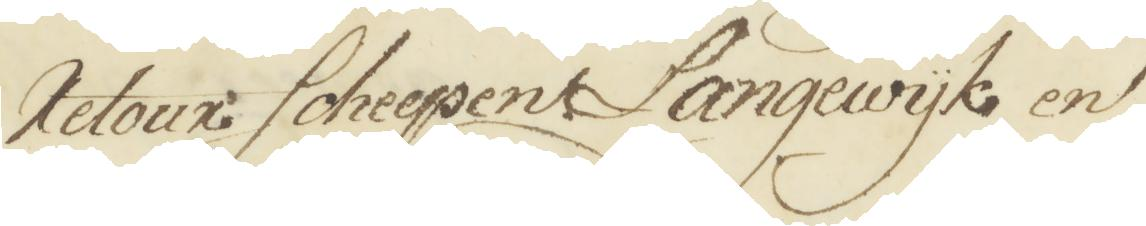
retour: scheepen. Langewijk en
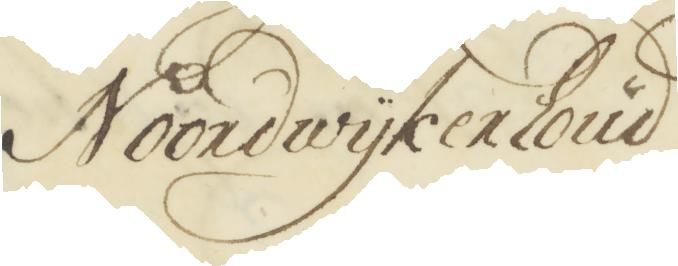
Noordwijkerhoud
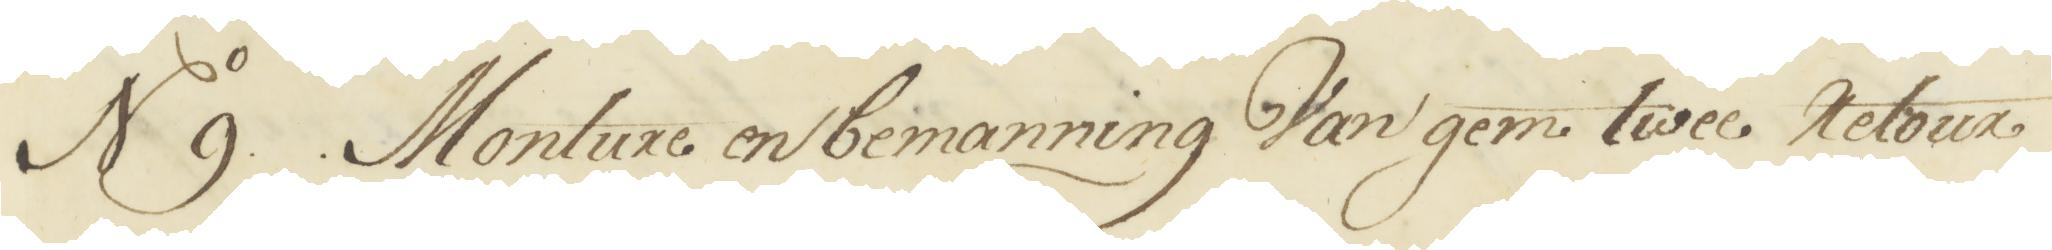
N:o 9. . Monture en bemanning Van gem twee retour
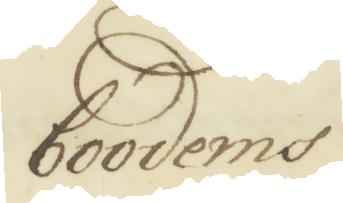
boodems
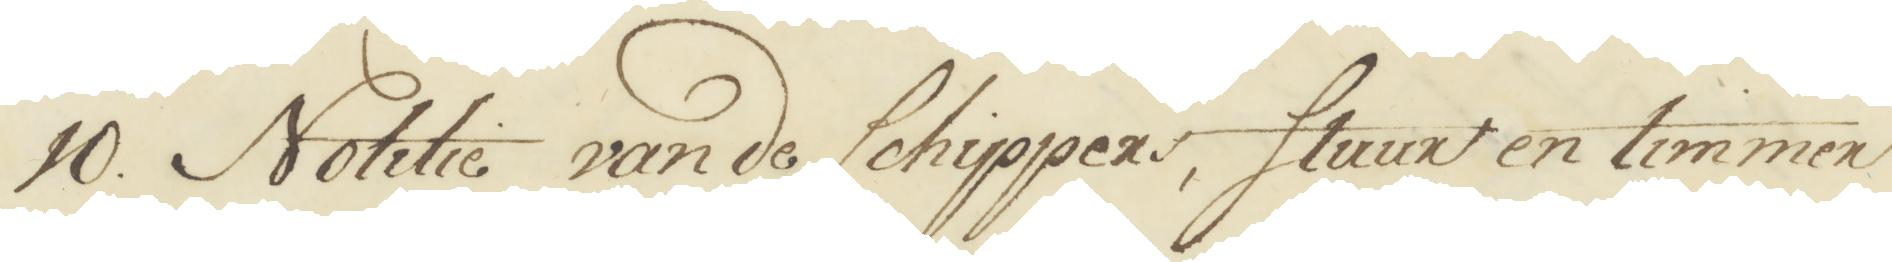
10. Notitie van de schippers, Stuur en timmer
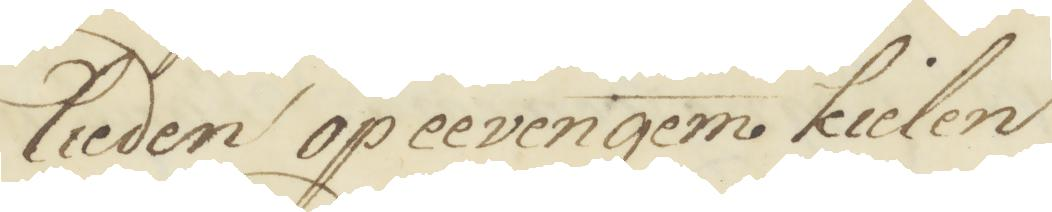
lieden op eevengem kielen
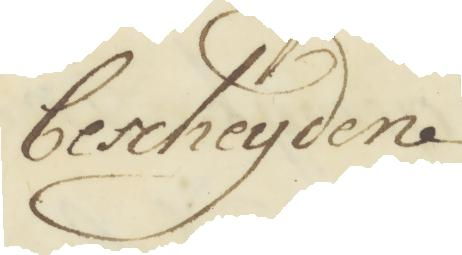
bescheijden.
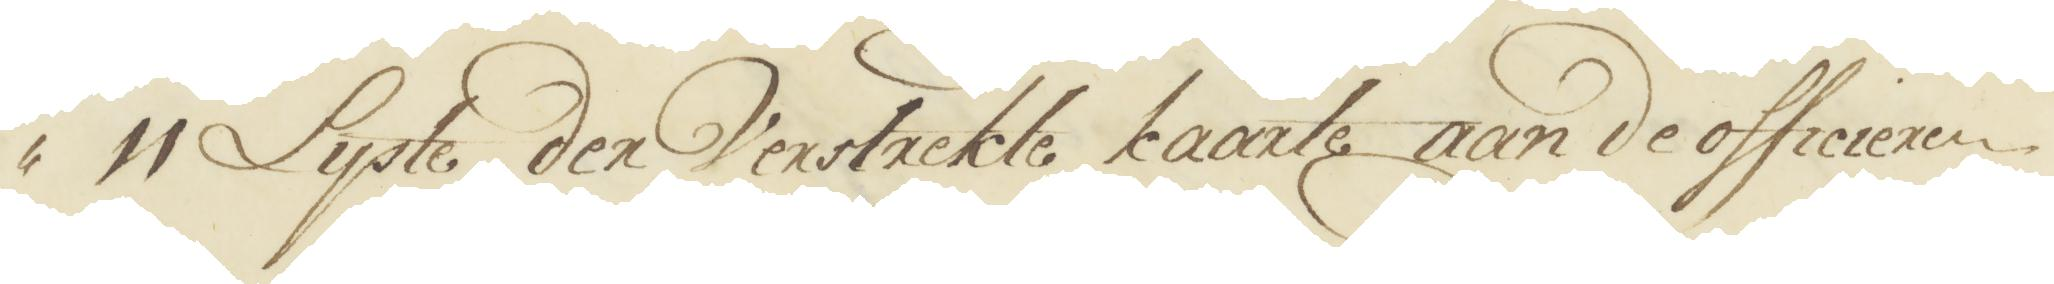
„ 11 Lijste der verstrekte kaarte aan de officieren
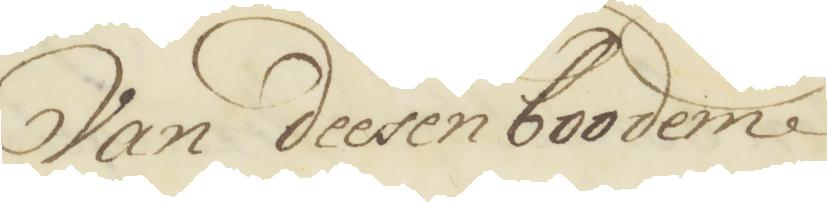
Van deesen boodem
